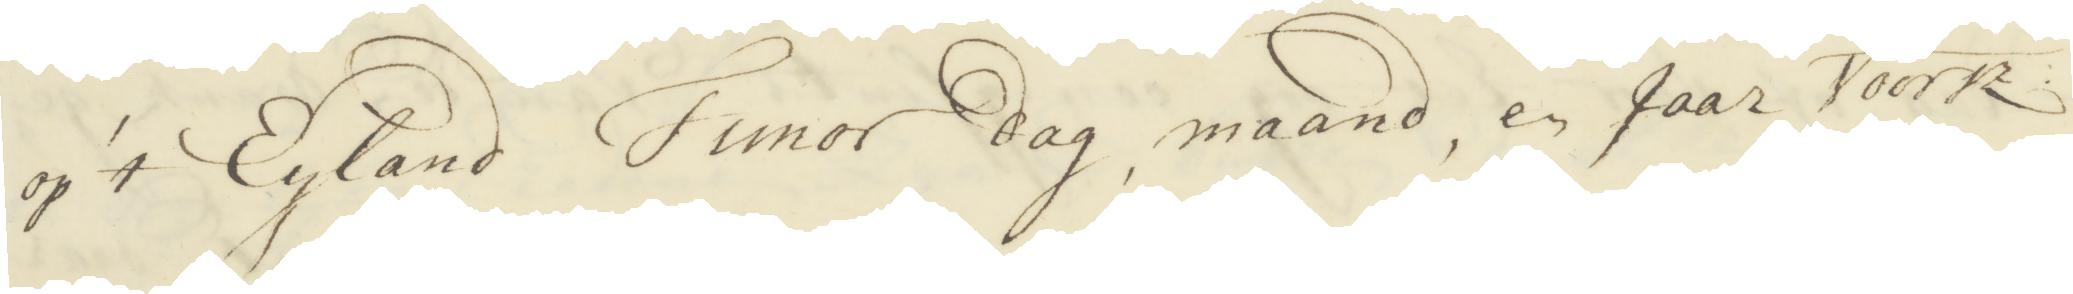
op ’t Eijland Timor dag, maand, en Jaar voorsz:
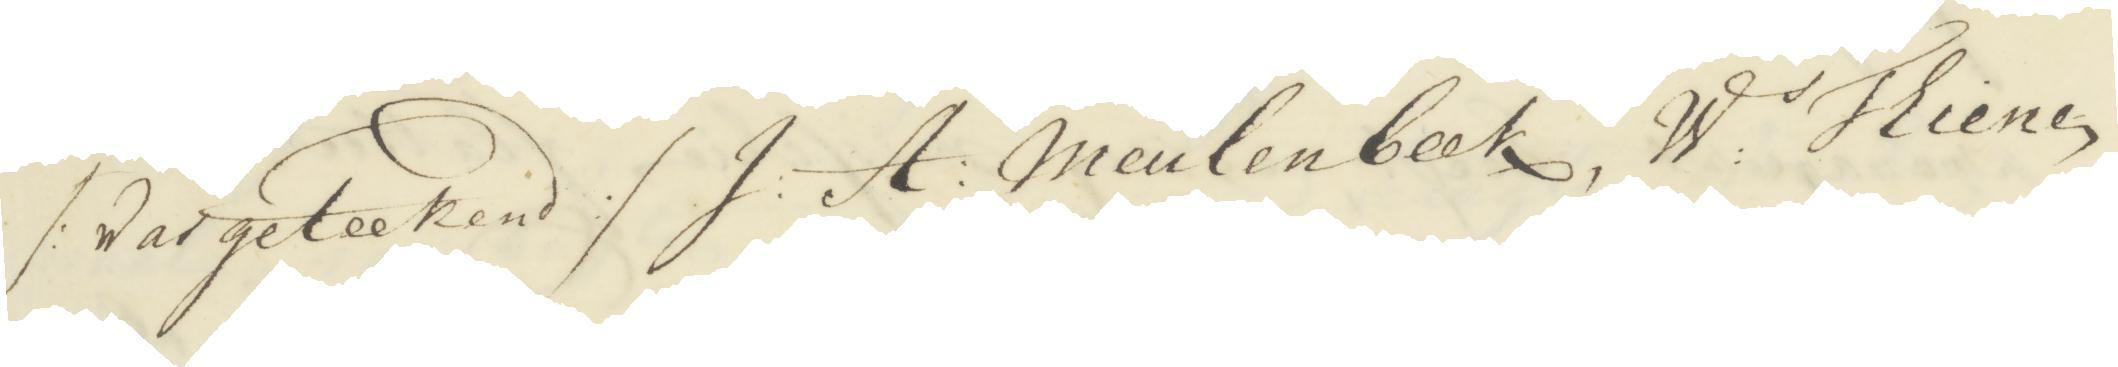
/:was geteekend :/ J: A: Meulenbeek, W:s Thienen,
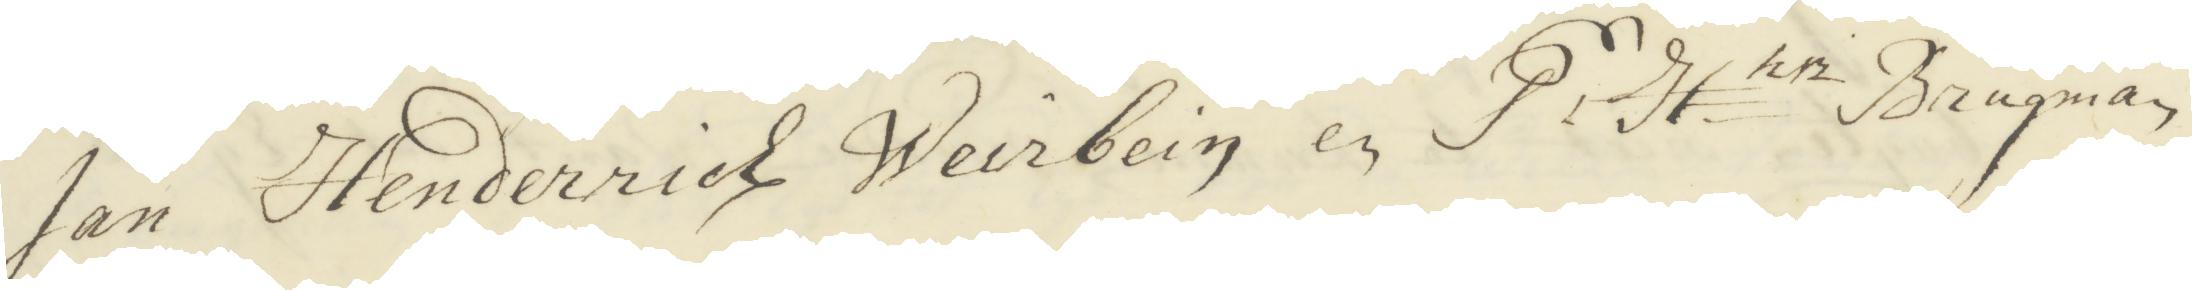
Jan Henderrich Weirbein en P:r H=ksz Brugman
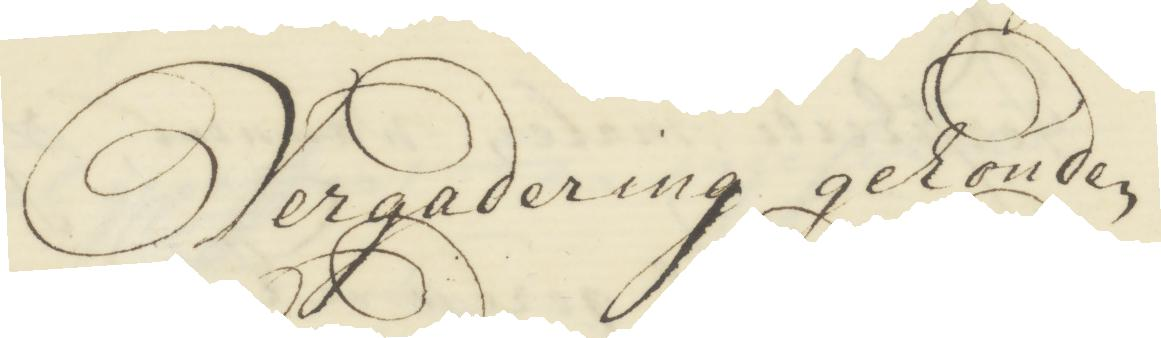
Vergadering gehouden
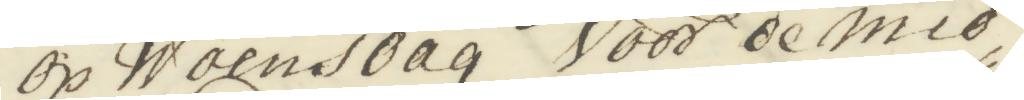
op Woensdag voor de mid„
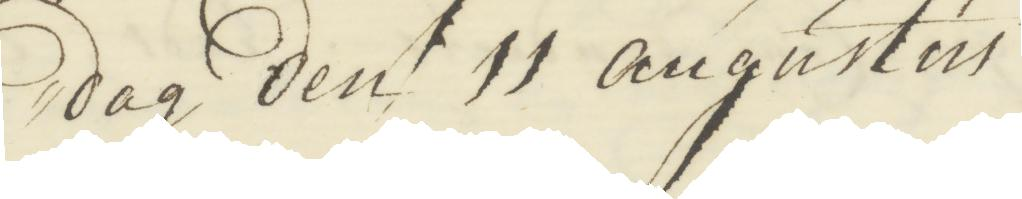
„dag den 11 augustus
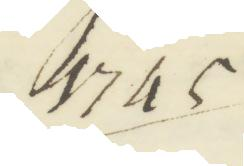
1745
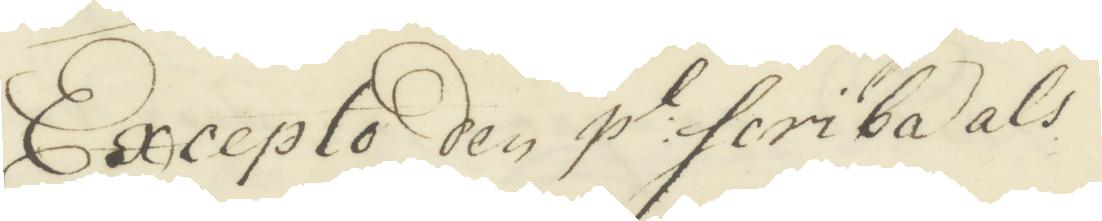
Excepto den p:l scriba als
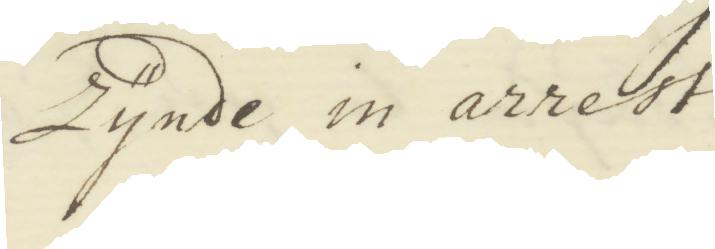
zijnde in arrest
